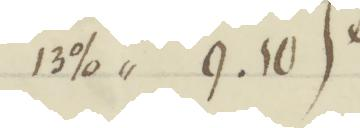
13% „ 9. 10 }
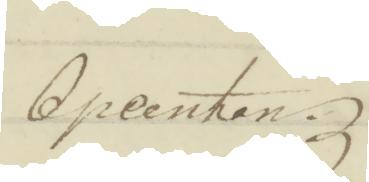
Opcenten.
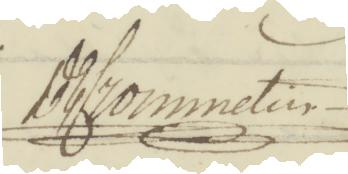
D F Crommelin
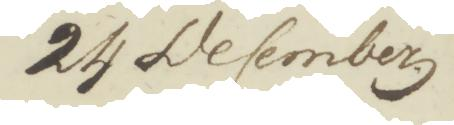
24 December.
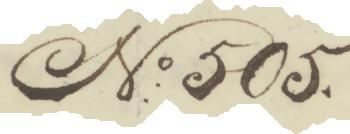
N:o 505.
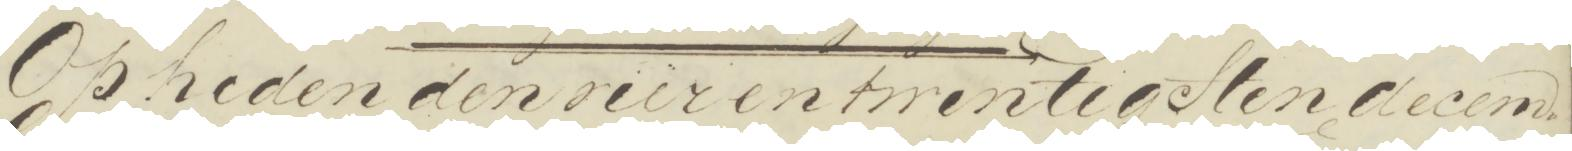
Op heden den vier en twintigsten decem„
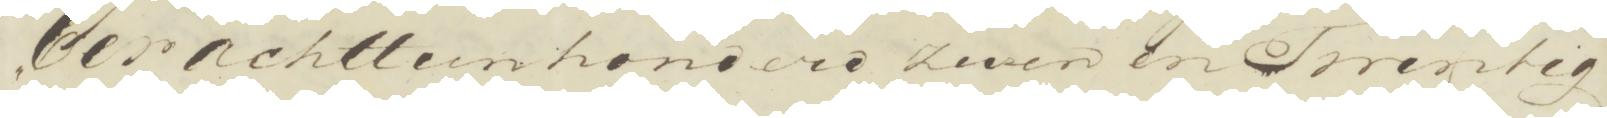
„ber achttienhonderd zeven en Twintig
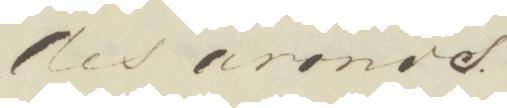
des avonds.
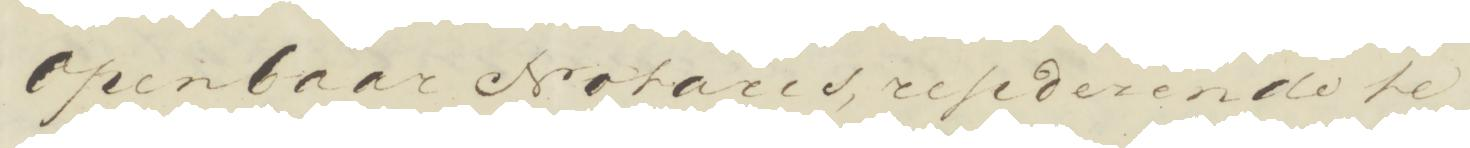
Openbaar Notaris, residerende te
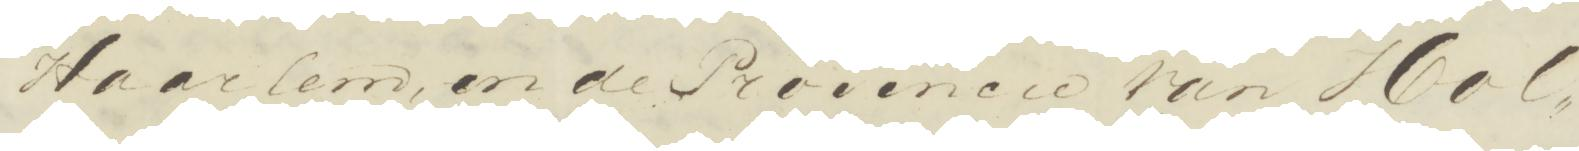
Haarlem, in de Provincie van Hol„
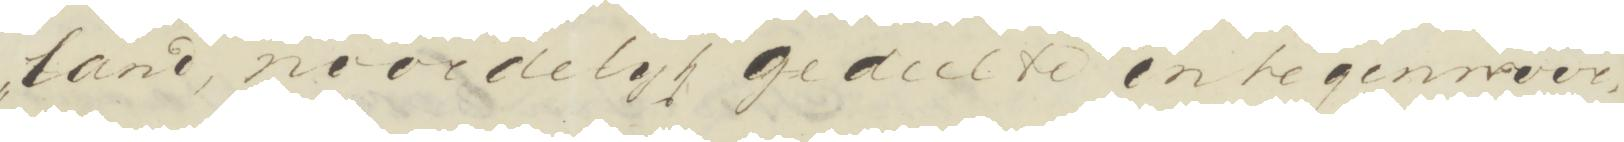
land, noordelyk gedeelte in tegenwoor,
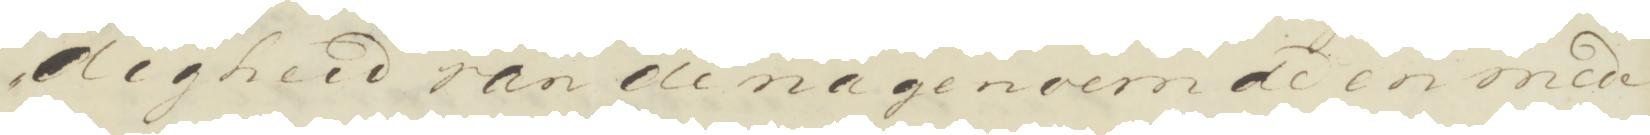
„digheid van de nagenoemde en mede
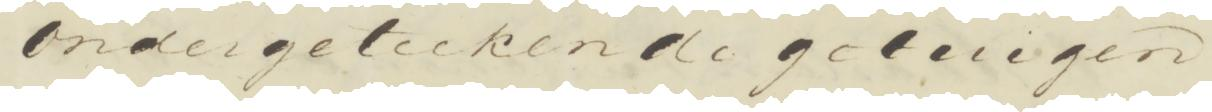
ondergeteekende getuigen
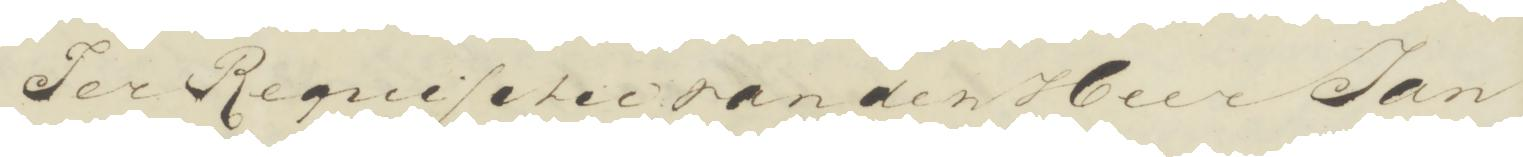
Ter Requisitie van den Heer Ian
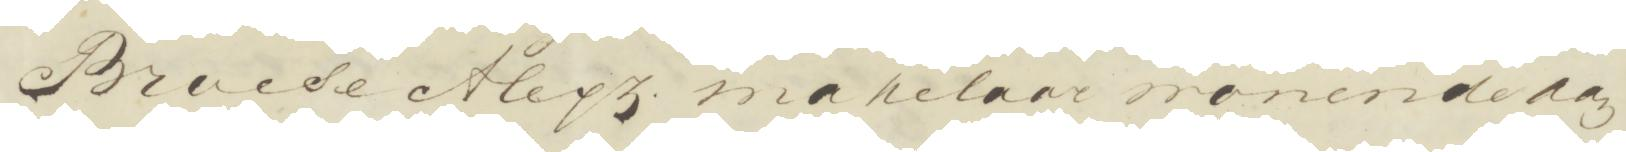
Broese Alexz. makelaar wonende aan
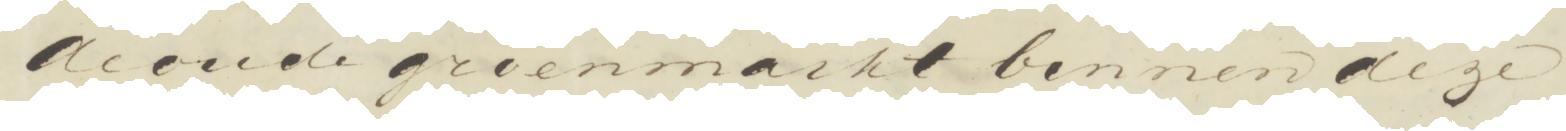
de oude groenmarkt binnen deze
